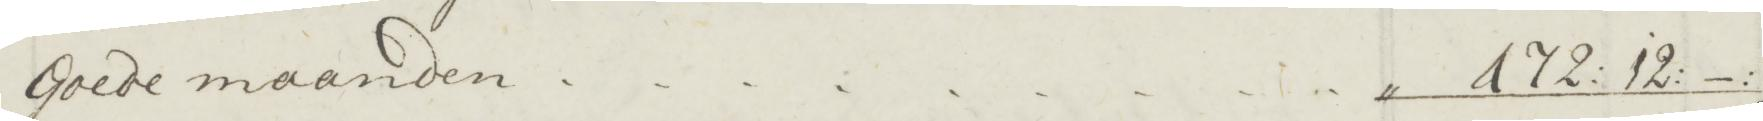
Goede maanden . . . . . . . . . „ 472: 12: —:
